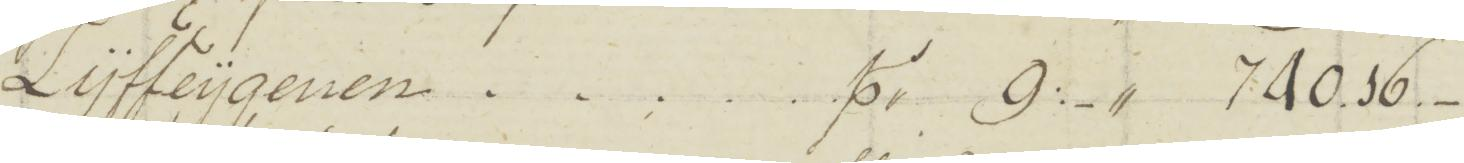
Lijffeijgenen . . . . . .p„s 9: – „ 740.16. –
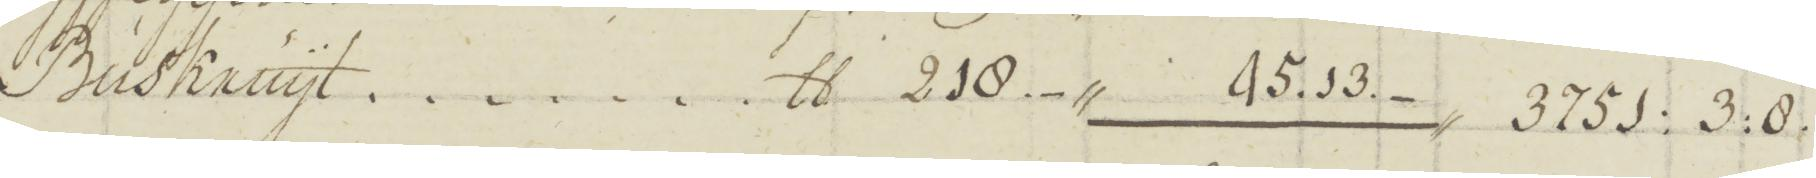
Buskruijt . . . . - . . lb 218.– „ 45.13. – „ 3751: 3: 8
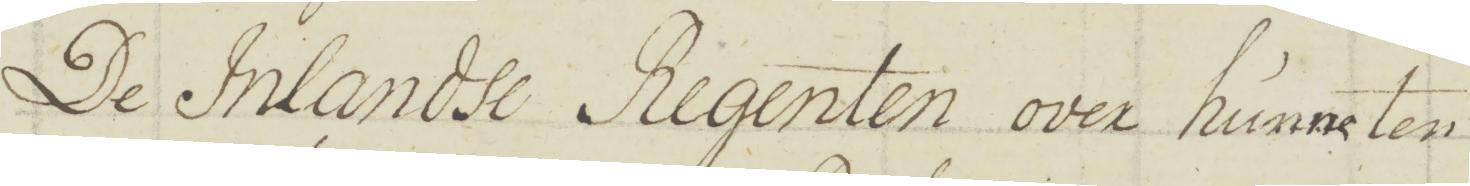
De Inlandse Regenten over hunne ten
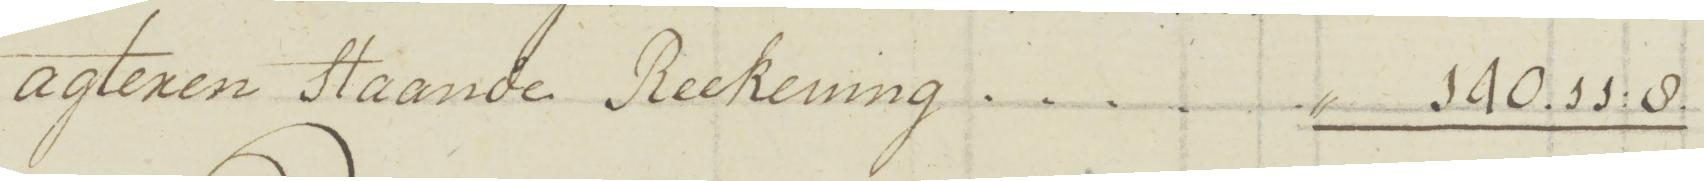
agteren staande Reekening . . . . . „ 140.11:8.
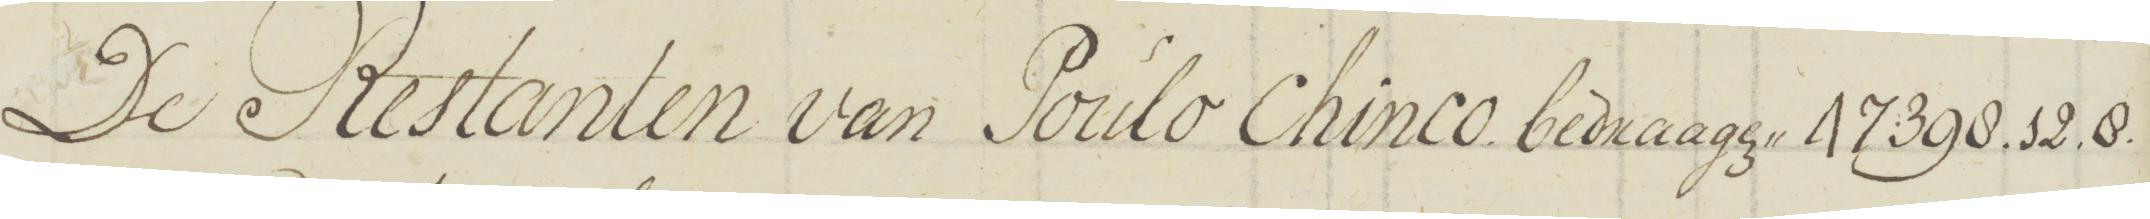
De Restanten van Poulo Chinco bedraagen „ 47398.12.8.
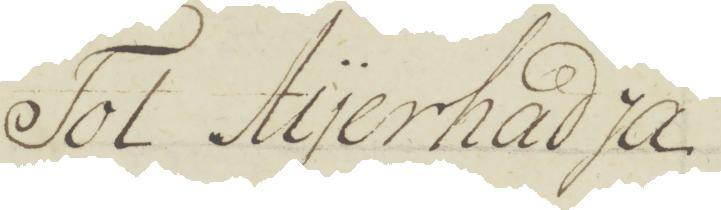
Tot Aijerhadja
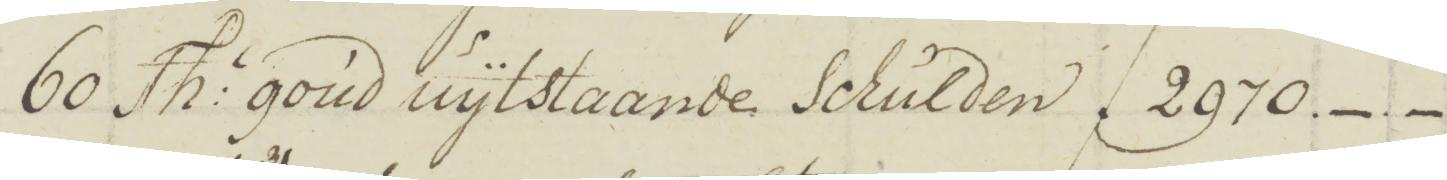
60 Th:l goud uijtstaande schulden ƒ2970. – . –
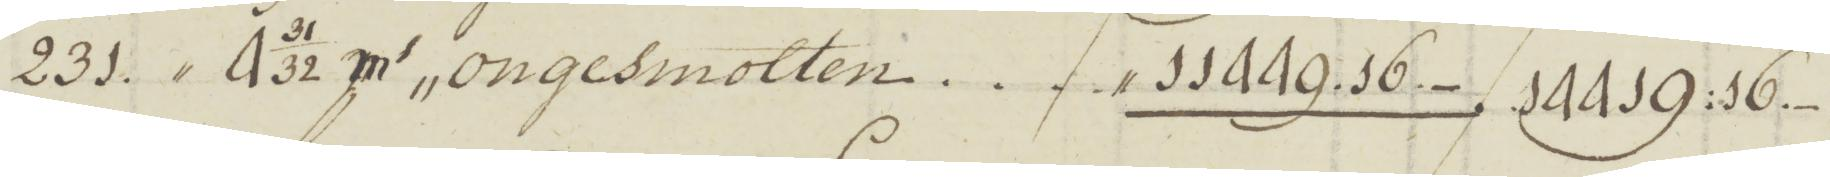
231. „ 4 31/32 m„s ongesmolten . . . . „ 11449.16. – ƒ.14419:16.–
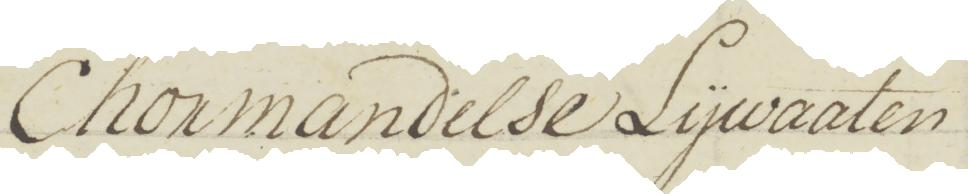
Chormandelse Lijwaaten
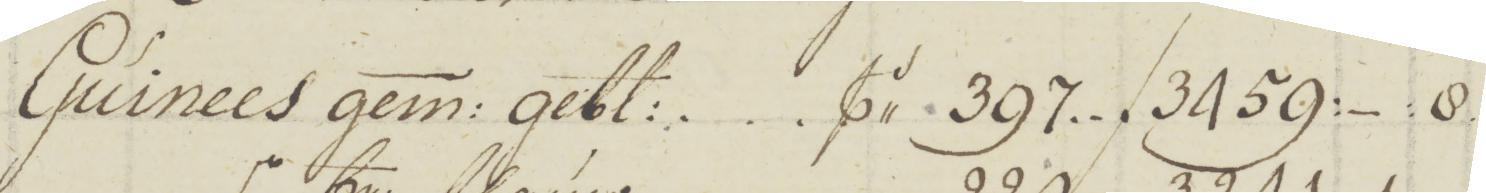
Guinees gem: gebl: . . . p„s 397. - ƒ3459: – : 8
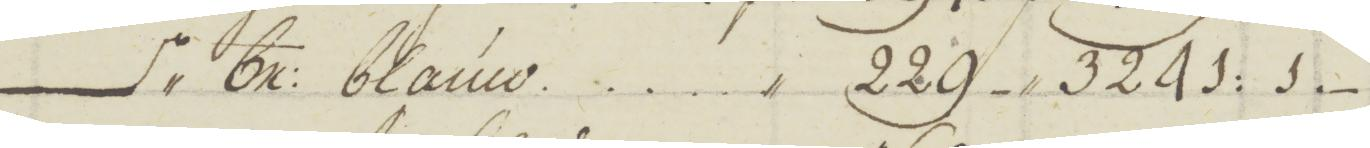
_„o br: blauw . . . . . „ 229 – „ 3241: 1.–
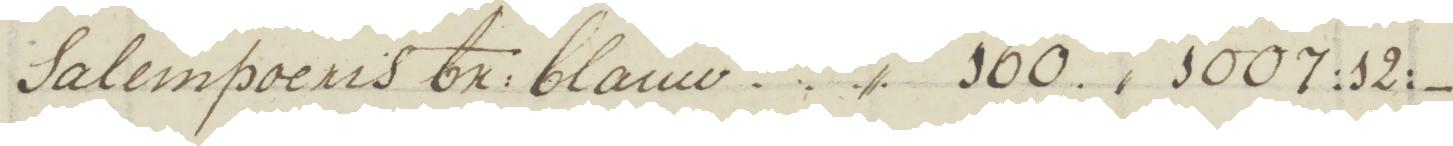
salempoeris br: blauw . . .„. 160. „ 1007:12:–
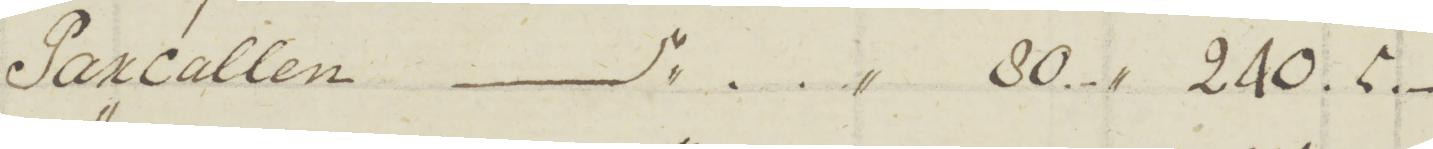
Parcallen _„o . . .„ 80.–„ 240. 5.–
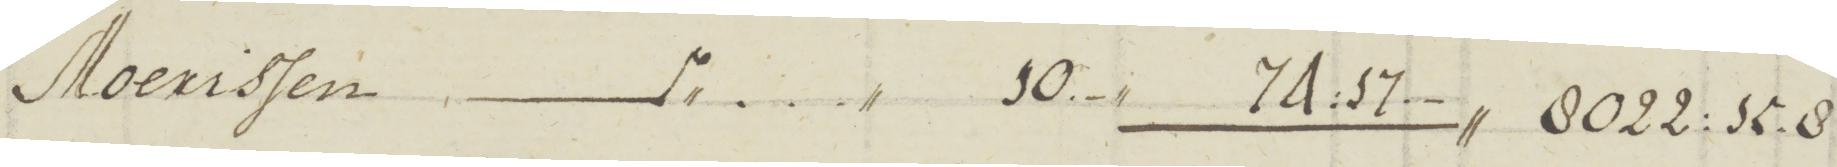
Moerissen _„o . . . „ 10. – „ 74:17. – „ 8022: 15.8
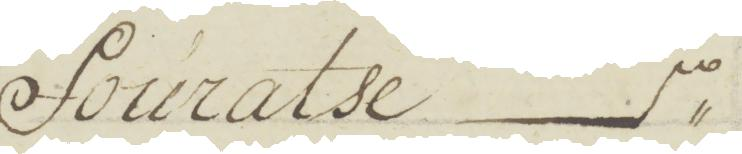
Souratse _„o
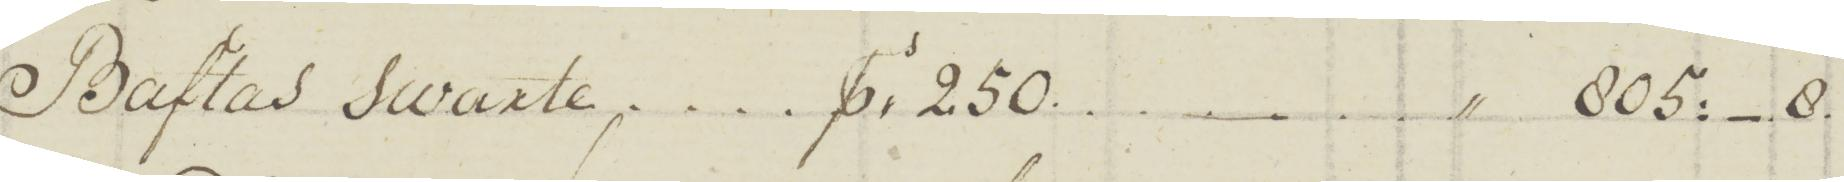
Baftas Swarte . . . . p„s 250. . . . . . . „ 805: –. 8.
